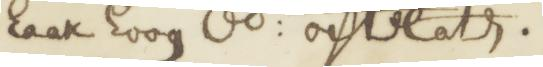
haar hoog Ed:s overtelaten.
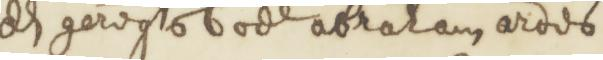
den geregts bode abraham ardes
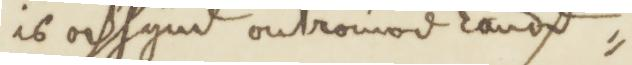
is oversijne ontrouwe hande„
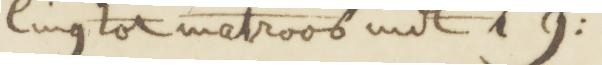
ling tot matroos met 19:
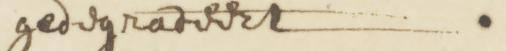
gedegradeert.
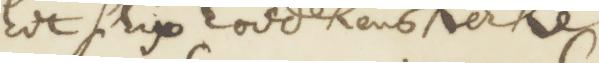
het schip hoedekenskerke
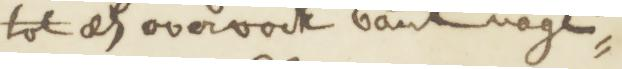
tot den overvoer van't nage„
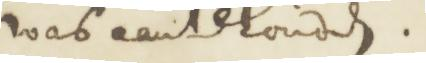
was aantehouden.
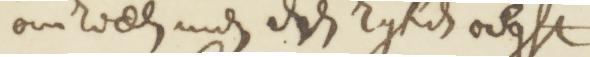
om reden men een rijken oegst
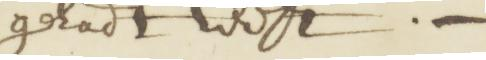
gehadt heeft.
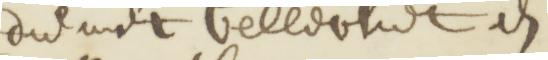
die met bellevliet en
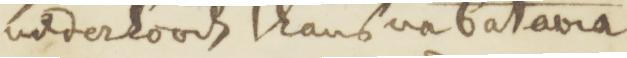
nederhooen thans na Batavia
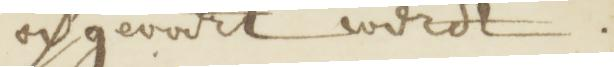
overgevoert werdt.
